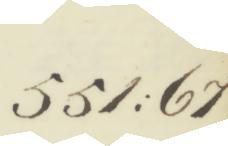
551:67
